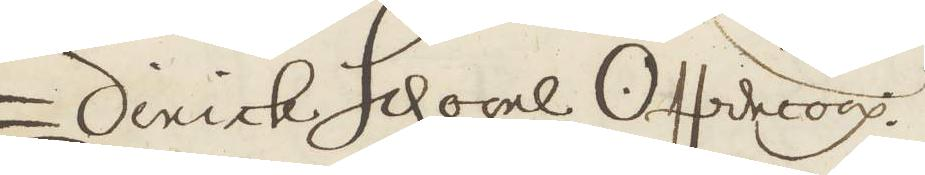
S=r dirick Schoorl Oppercoop:
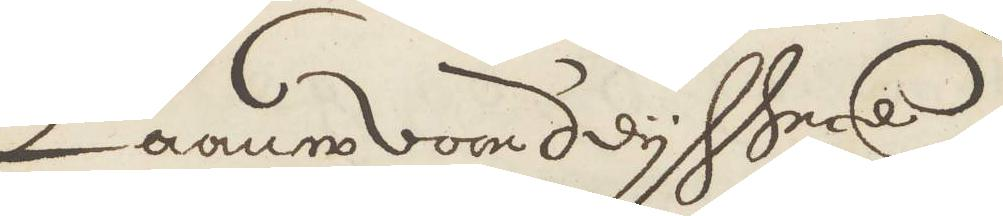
Paauw voor d'eijss„rce
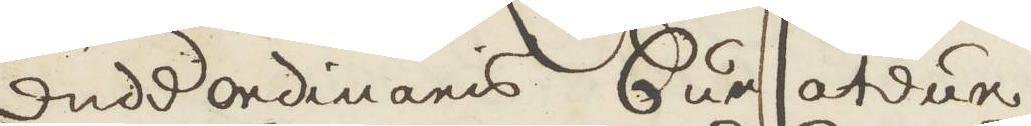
ende ordinaris Curateur
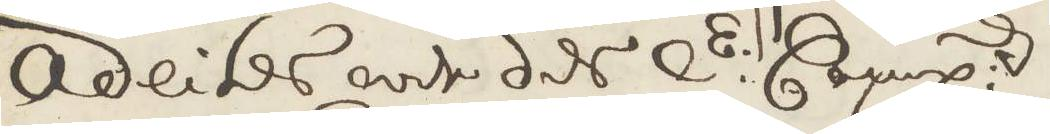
adlites over der E: Comp:e
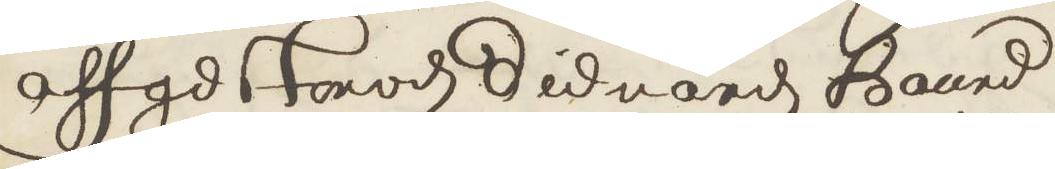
affgestorven dienaren haare
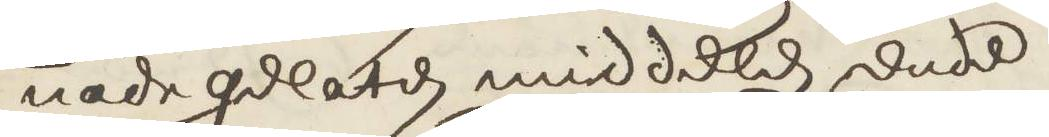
naer gelaten middelen, ende
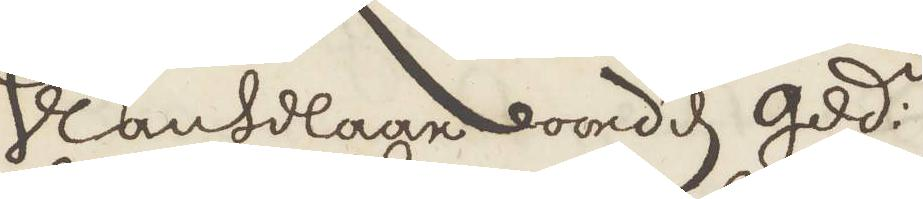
Kanselaar voorden ged:e
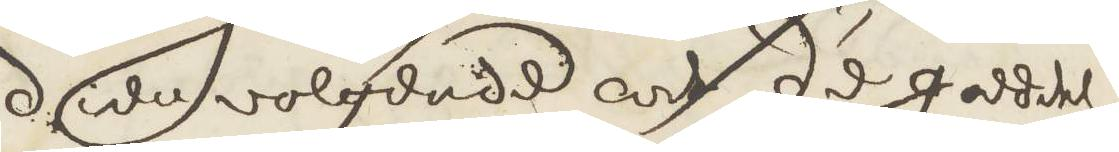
dien volgende wt de goederen
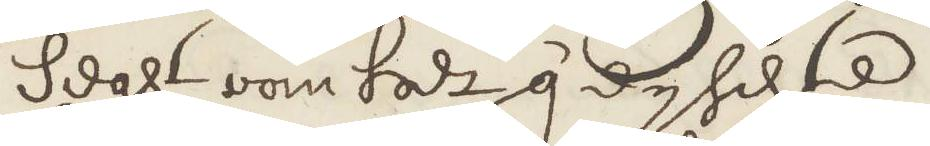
seght van het g’eyschte
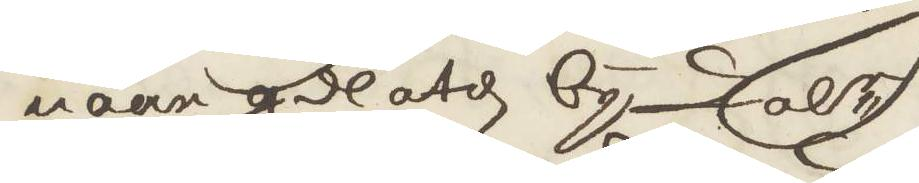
naar gelaten bij Zal„r
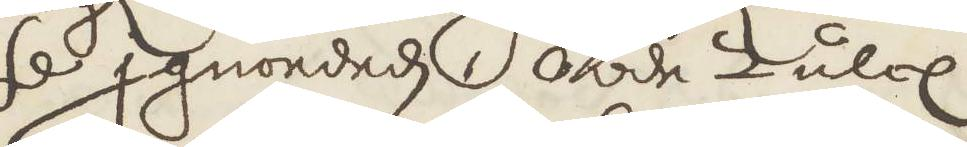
te jgnoreren, over zulcx
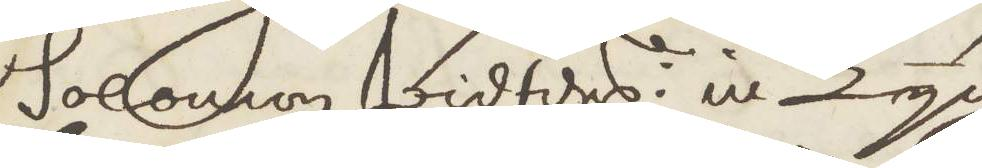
solomon Pieters: in zijn
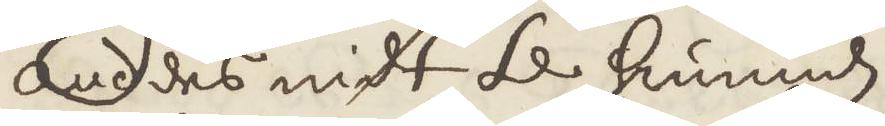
anders niet te kunnen
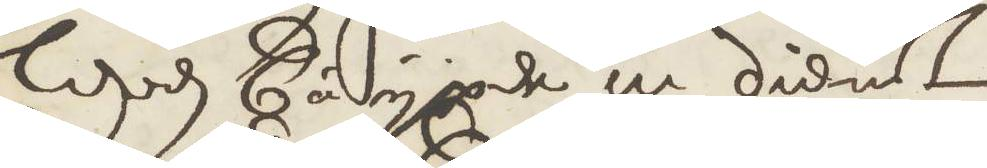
leven Cuijper in dienst
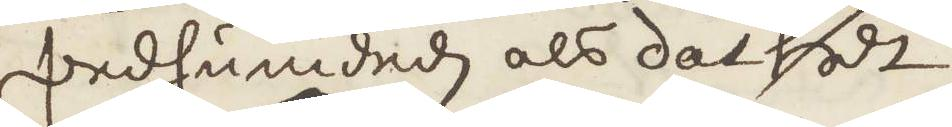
presumeren als dat het
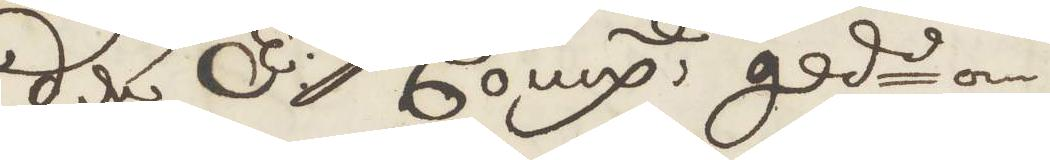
der E: Comp:e ged=e om
